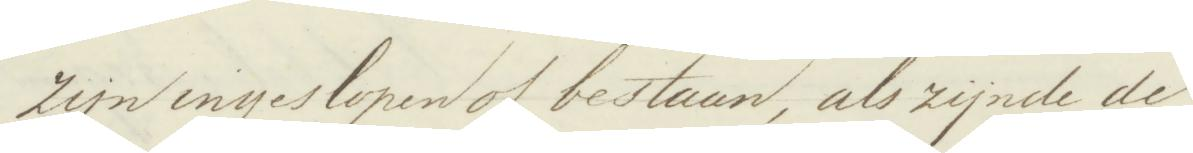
zijn ingeslopen of bestaan, als zijnde de
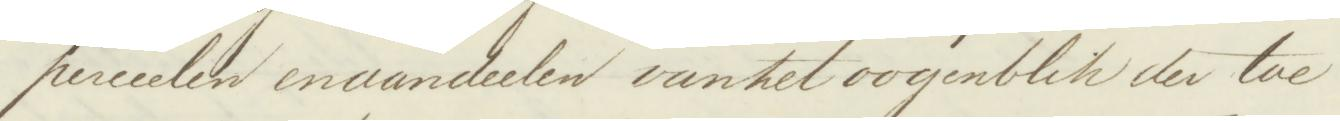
perceelen enaandeelen van het oogenblik der toe
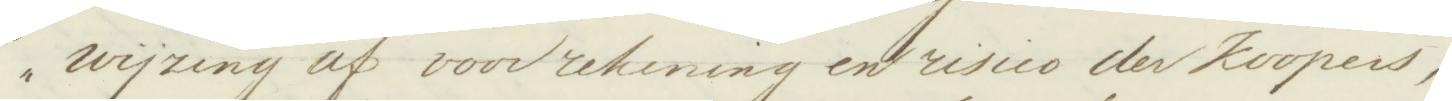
„ wijzing af voor rekening en risico der koopers,
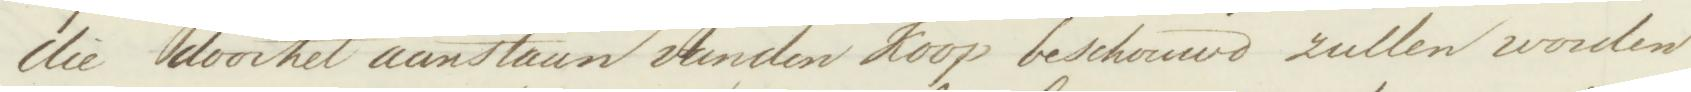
die door het aanstaan vanden Koop beschouwd zullen worden
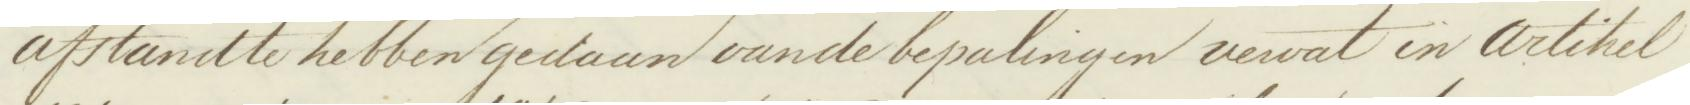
afstandte hebben gedaan van de bepalingen vervat in Artikel
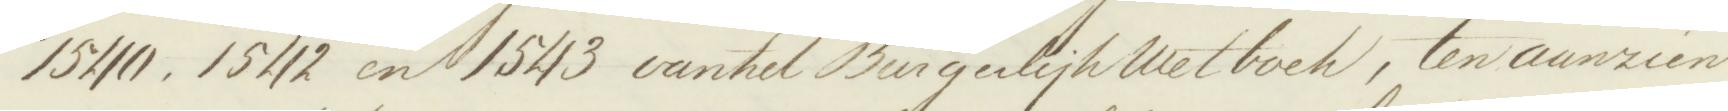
1540, 1542 en 1543 van het Burgerlijk Wetboek, ten aanzien
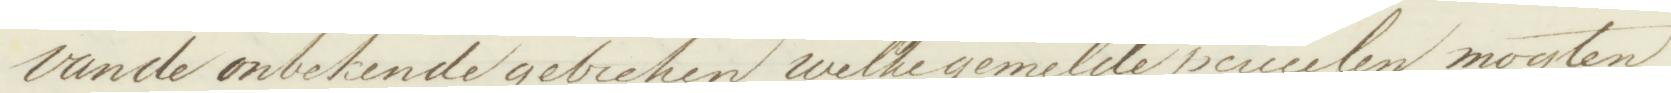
vande onbekende gebreken welke gemelde perceelen mogten
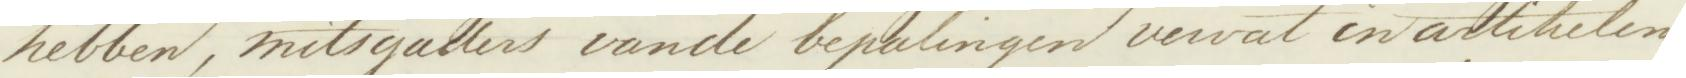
hebben, mitsgaders vande bepalingen vervat in artikelen
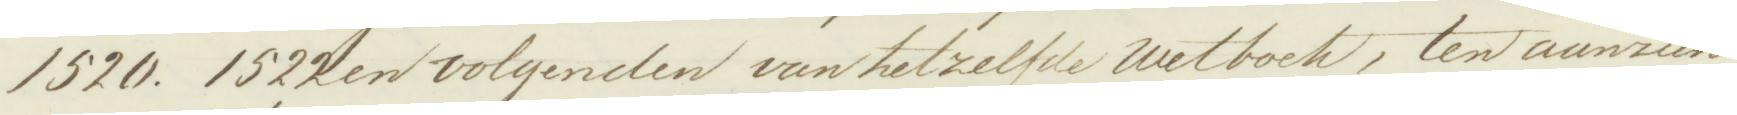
1520. 1522 en volgenden van hetzelfde wetboek, ten aanzien
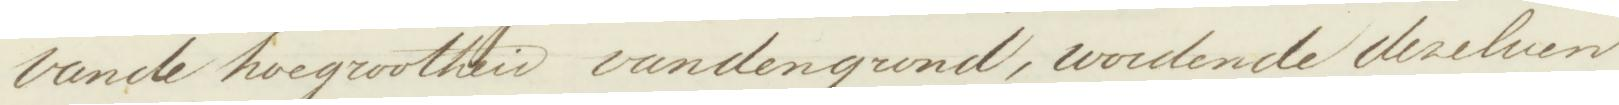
vande hoegrootheid van den grond, wordende dezelven
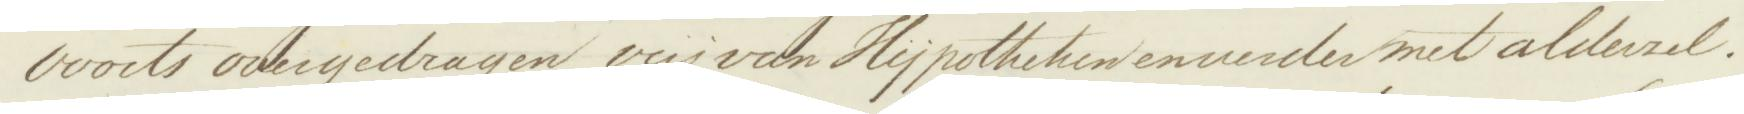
voorts overgedragen vrij van Hijpotheken enverder met alderzel.
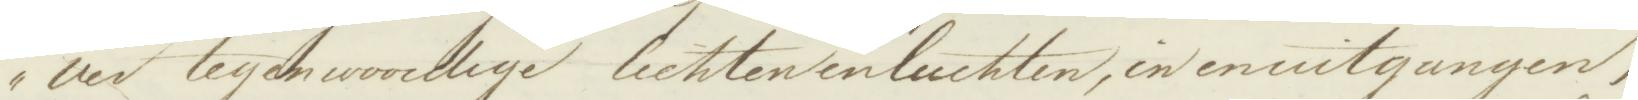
„ ver tegenwoordige lichten enluchten, in enuitgangen,
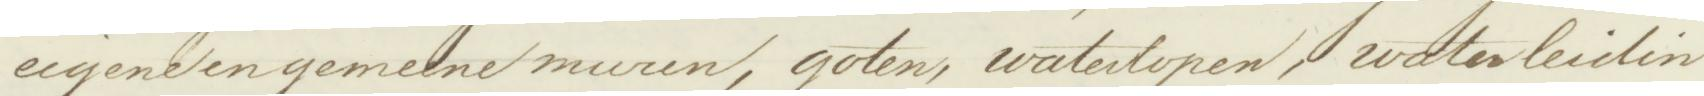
eigensen gemeene muren, goten, waterlopen, waterleidin
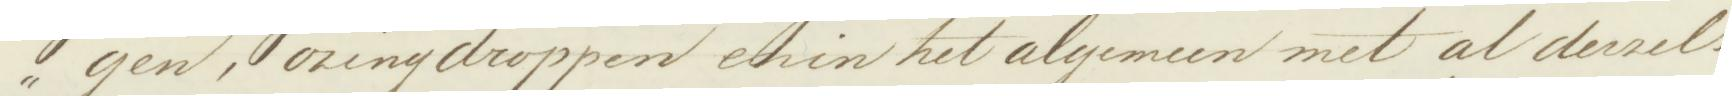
„ gen, ozingdroppen en in het algemeen met al derzel„
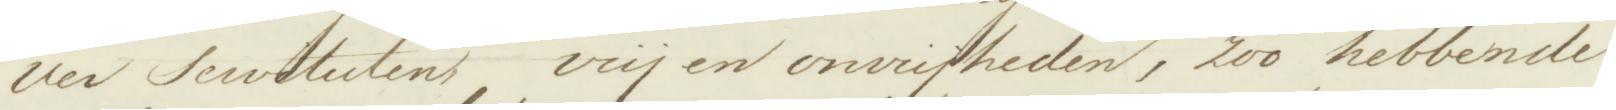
ver servituten, vrij en onvrijheden, zoo hebbende
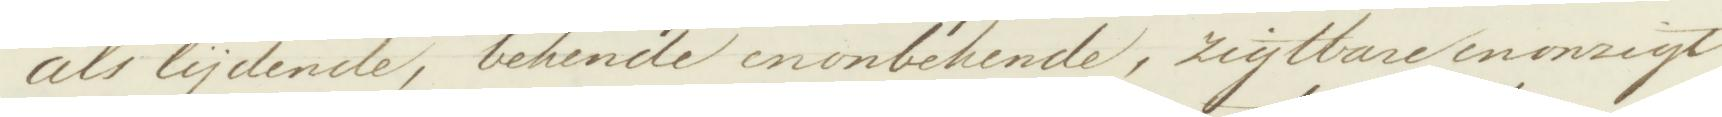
als lijdende, bekende en onbekende, zigtbare en onzigt
